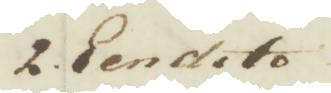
2. Een dito
